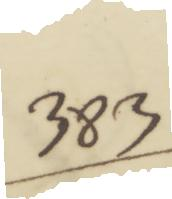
383
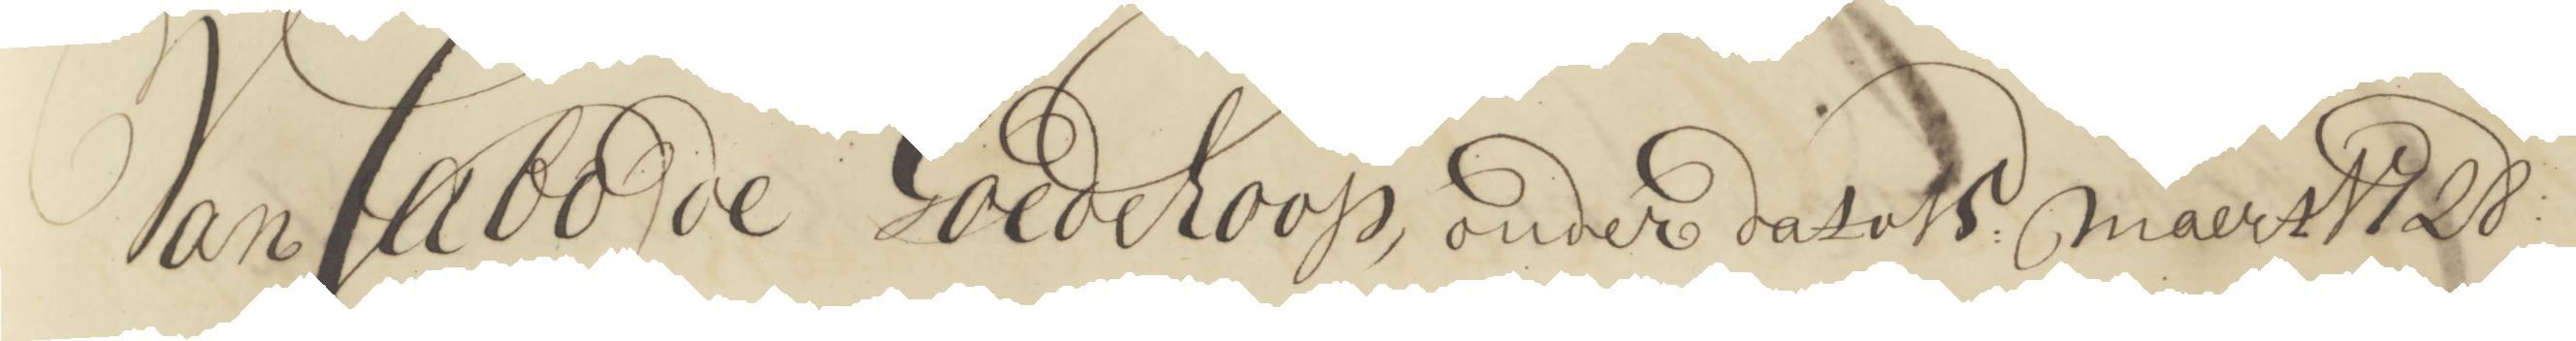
Van Cabo de Goedehoop, onder dato 15:' maert 1728:
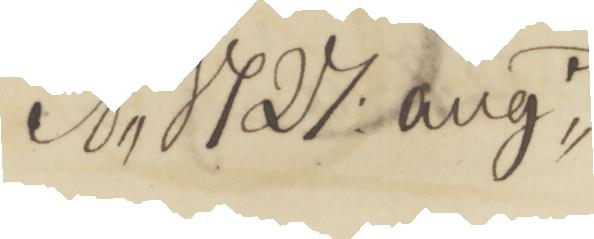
A„o 1727: aug„s
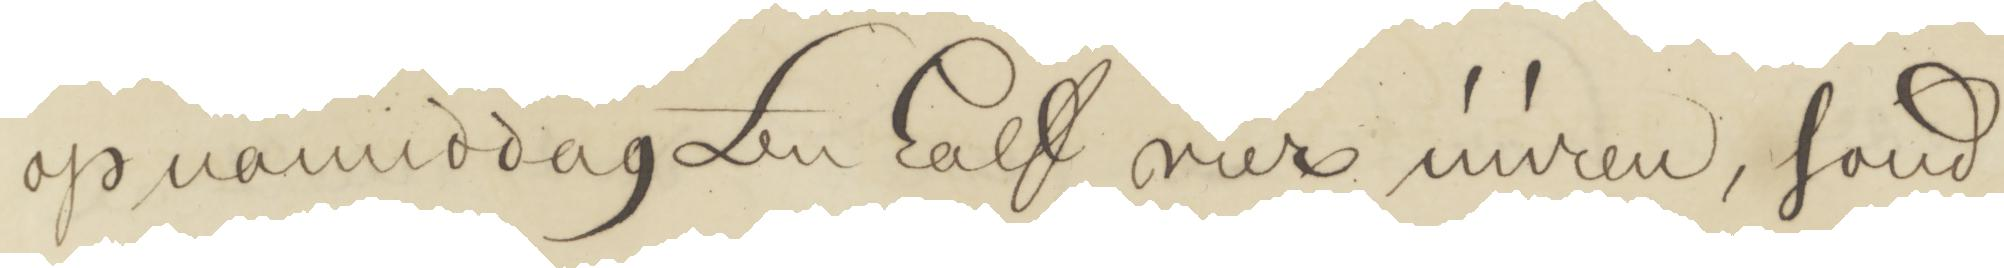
op namiddag ten half vier uuren, soud
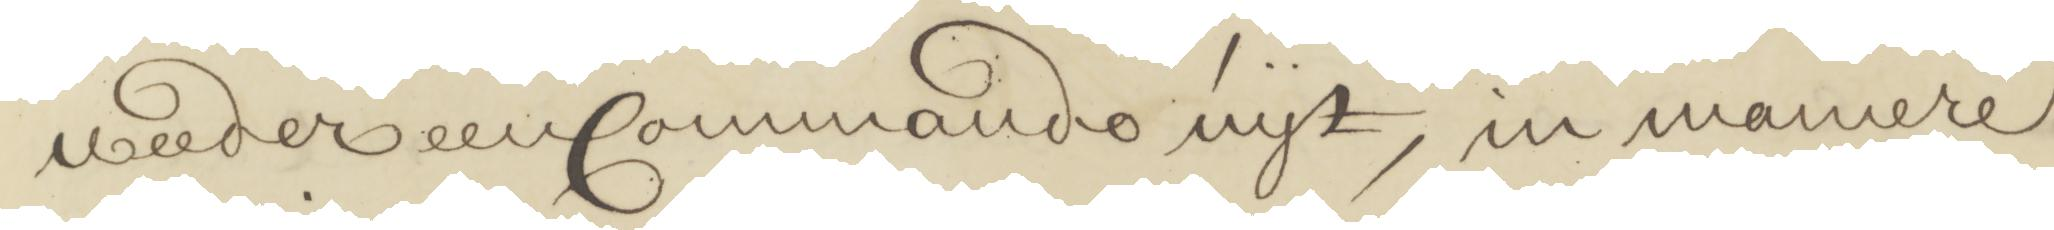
weeder een Commando uijt, in maniere
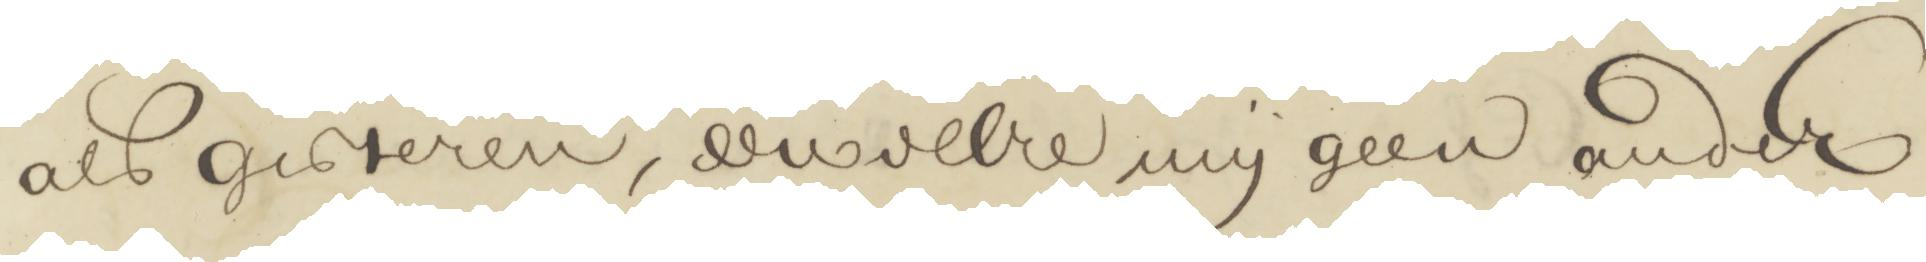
als gisteren, dewelke mij geen ander
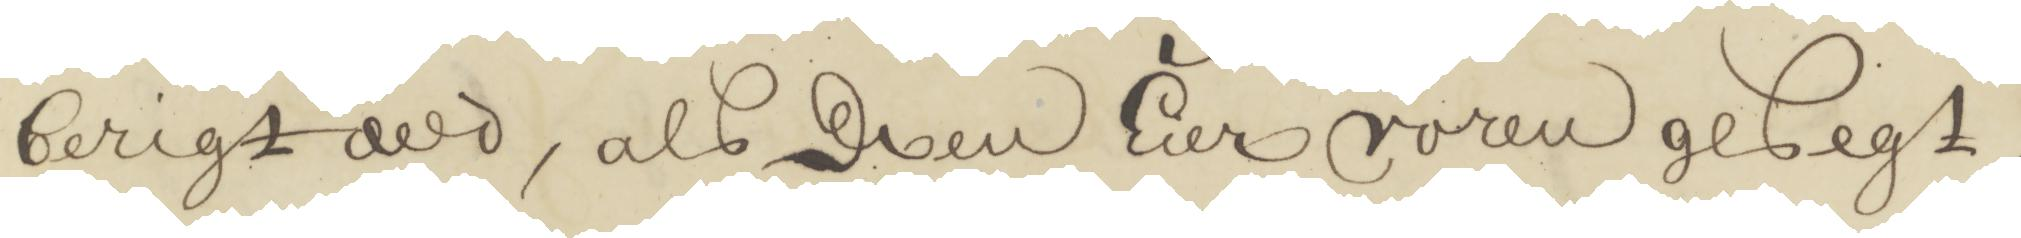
berigt deed, als even hier voren gesegt,
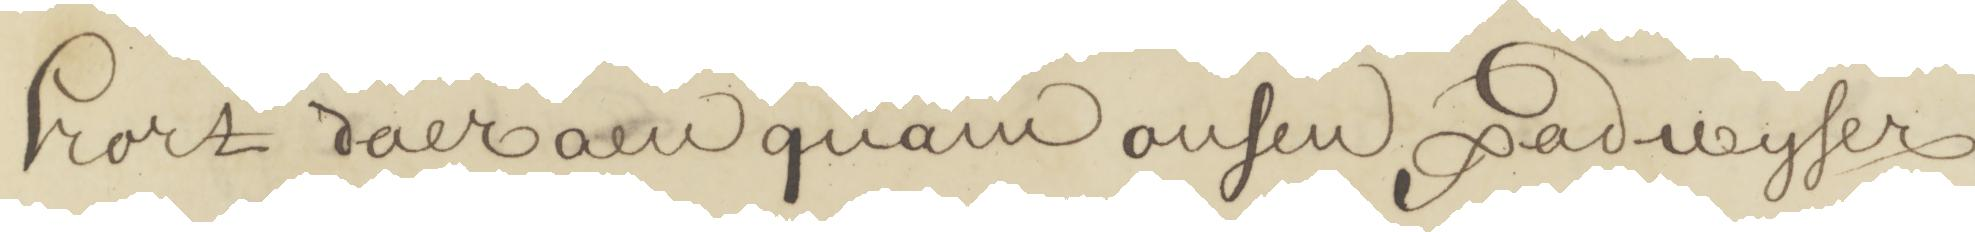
kort daer aen quam onsen padwijser
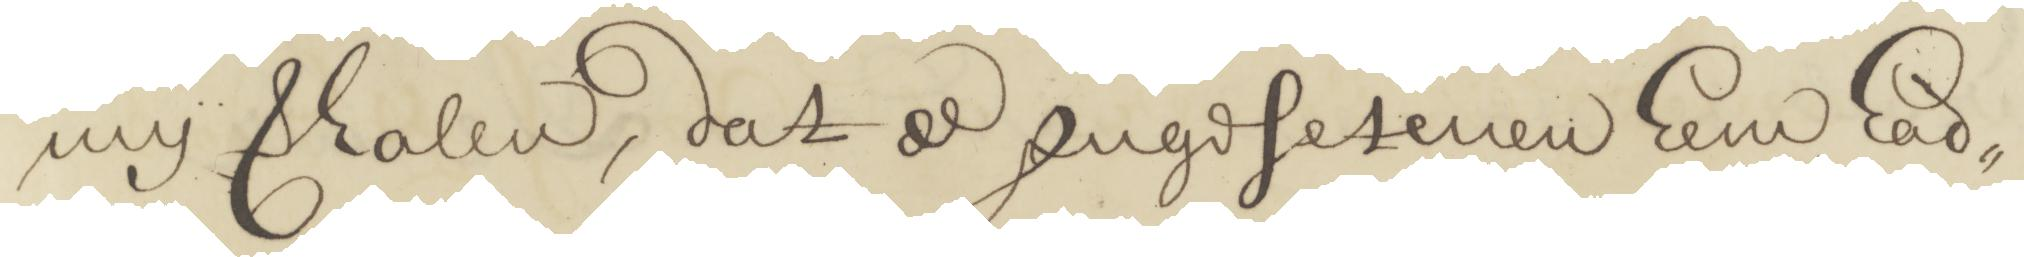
mij verhalen, dat de jngesetenen hem had„
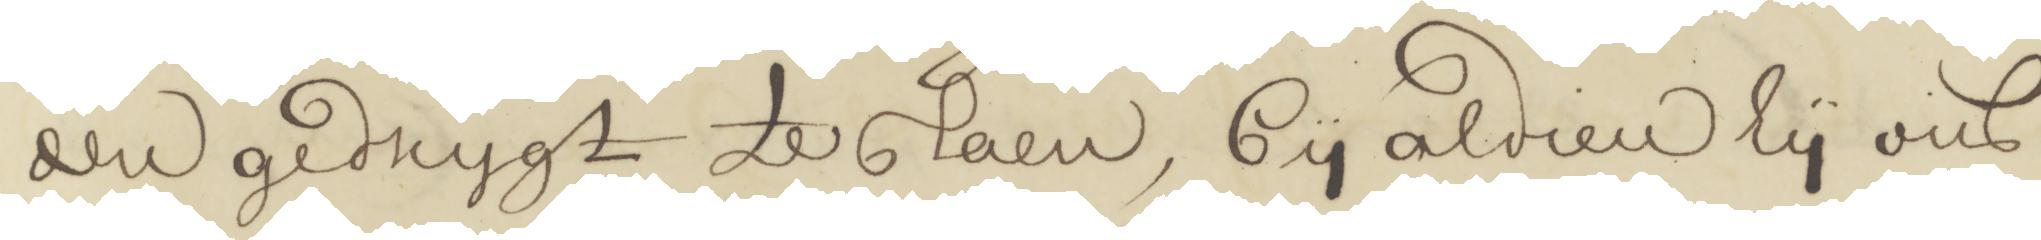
den gedrijgt te slaen, bij aldien hij ons
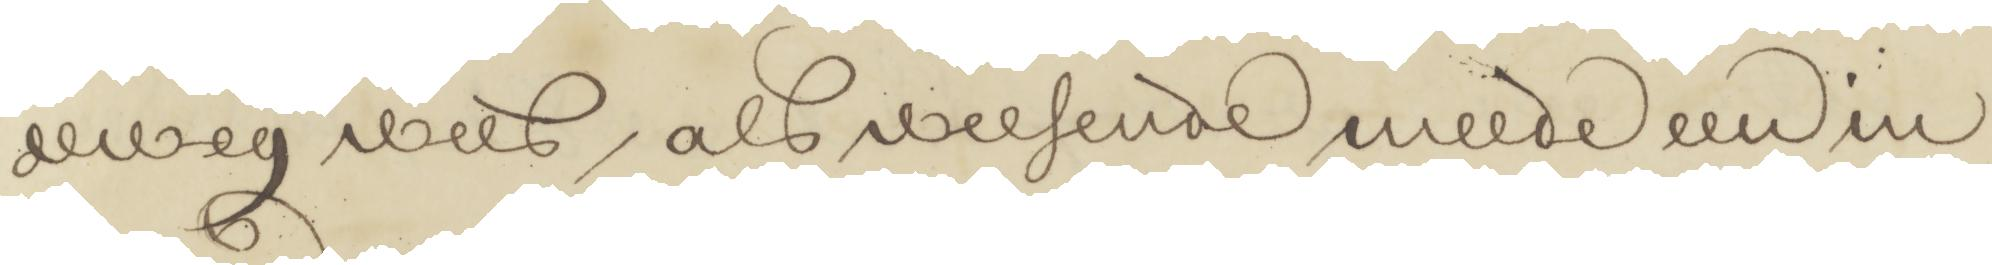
deweg wees, als weesende meede een in
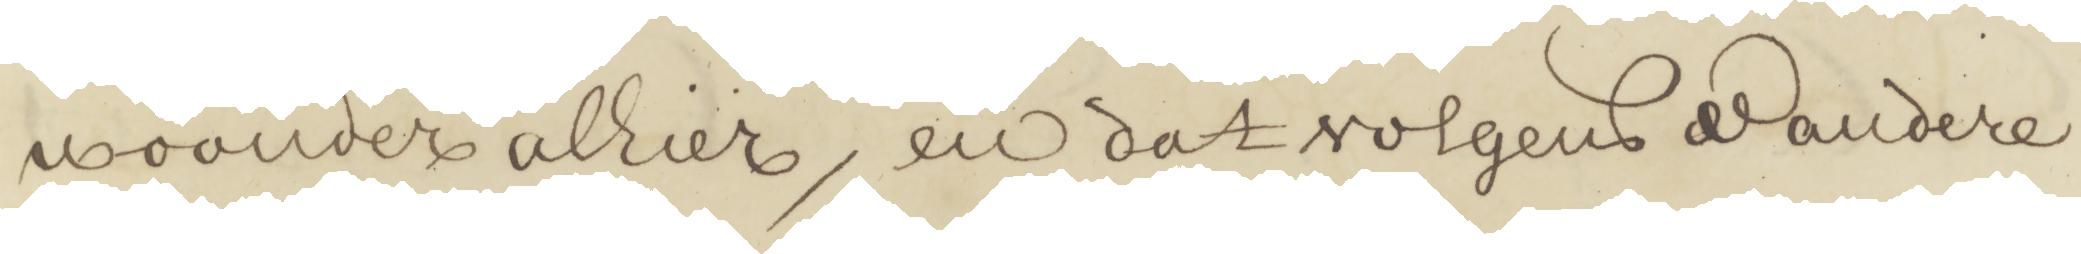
woonder alhier, en dat volgens de andere
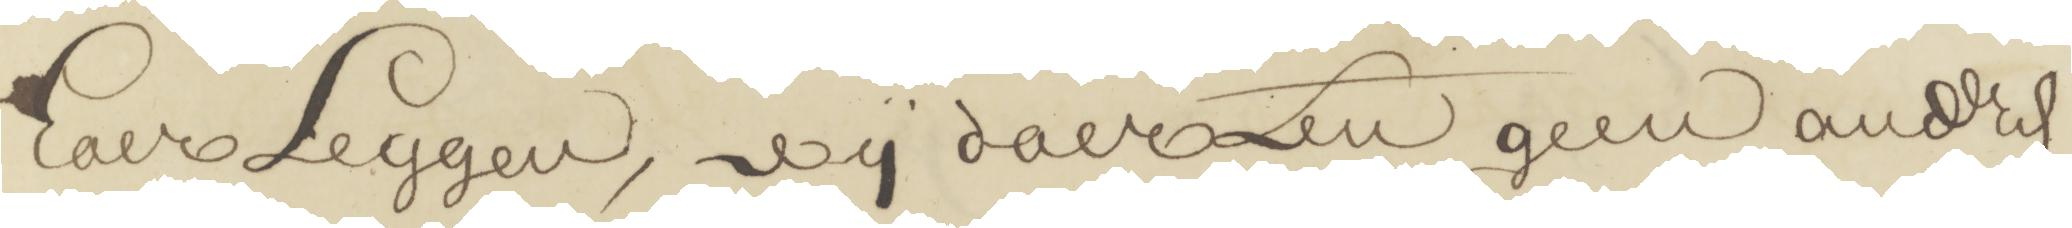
haer seggen, wij daer ten geen anderen
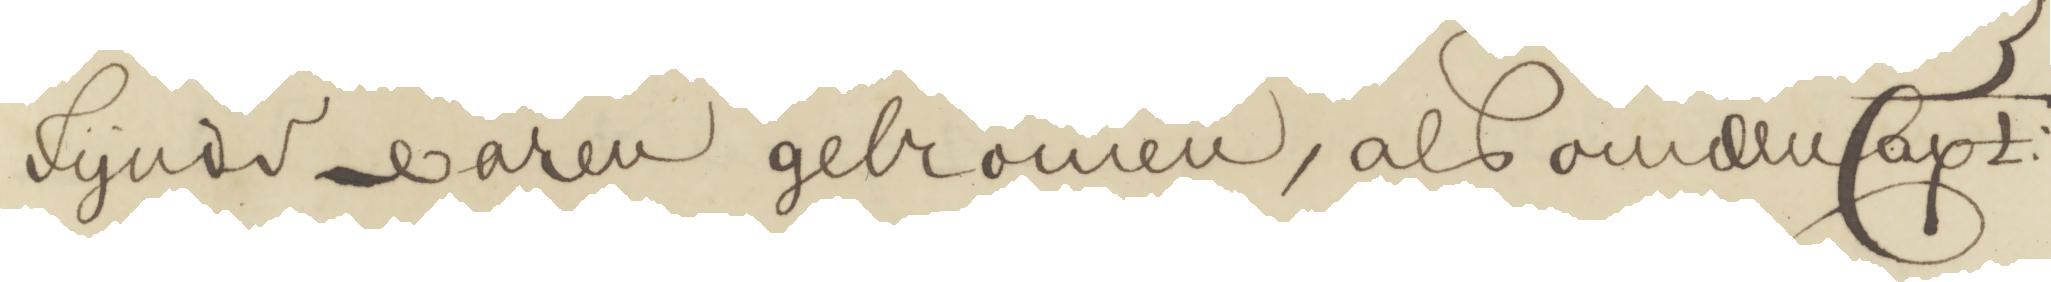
Eijnde waren gekomen, als om den Capt
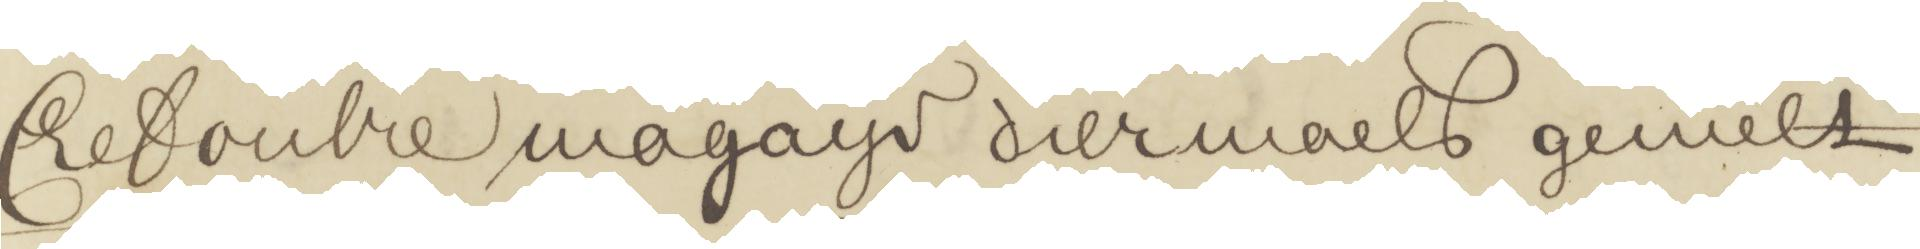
Chefonke magaije diermaels gemelt
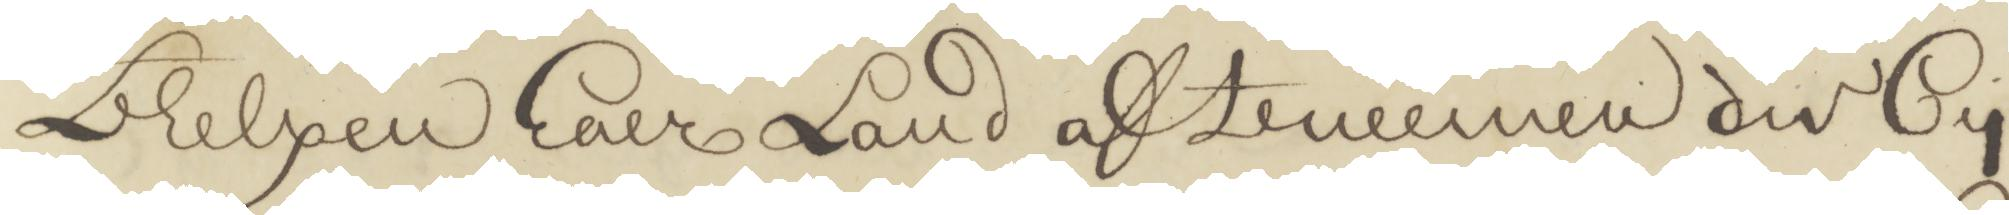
te helpen haer Land afteneemen die bij
